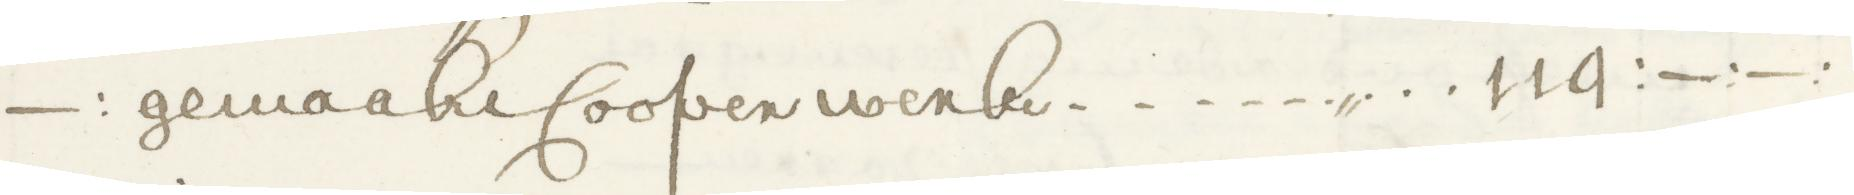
—: gemaakt Cooper werk - - - - -„ . . .114: —: —:
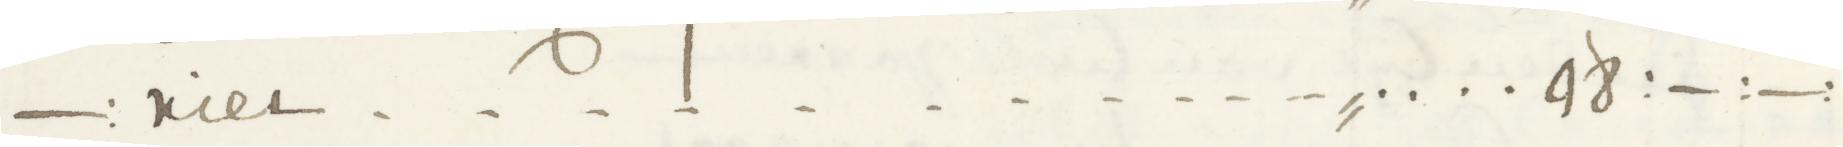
—: riet - - - - - - - - - - - - „ . . . . 48: —: —:
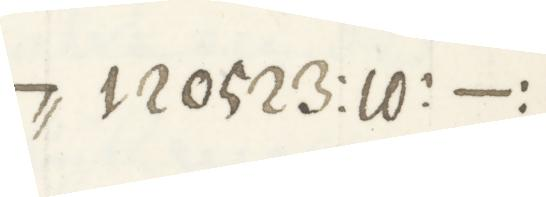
„ 120523: 10: —:
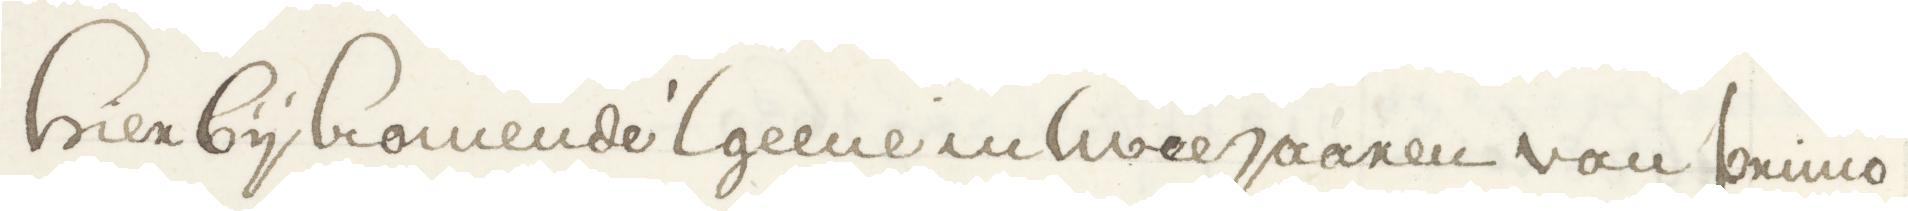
hier bij komende ’t geene in twee Jaaren van primo
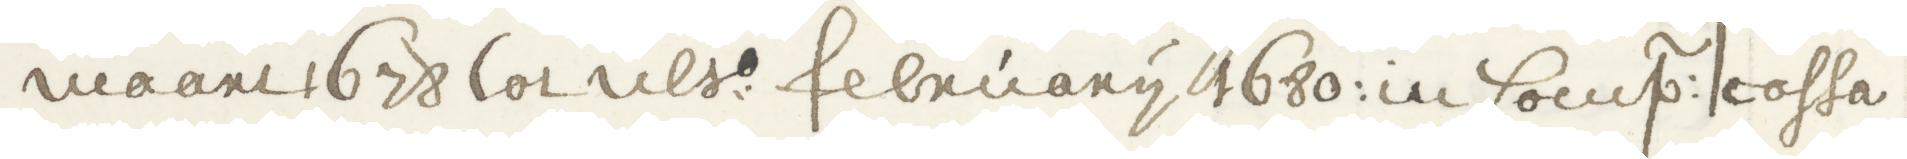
maart 1678 tot ult:o februarij 1680: in Comp: cassa
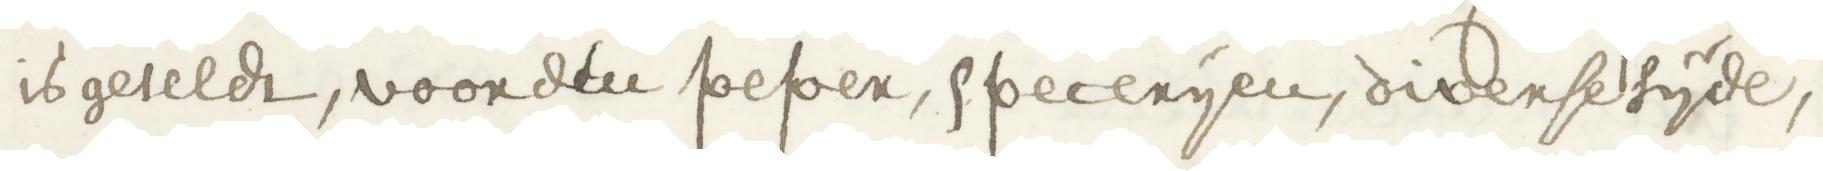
is geteldt, voor den peper, specerijen, diverse sijde,
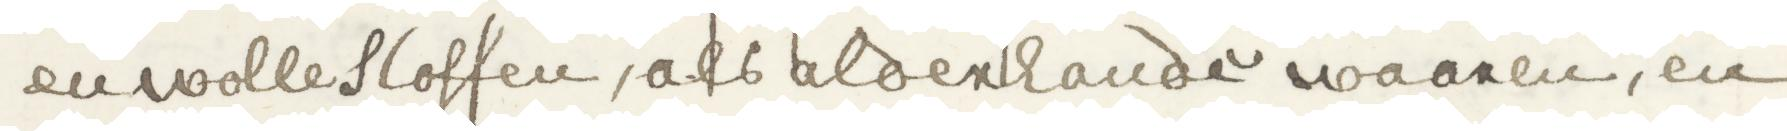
en wolle stoffen, als alderhande waaren, en
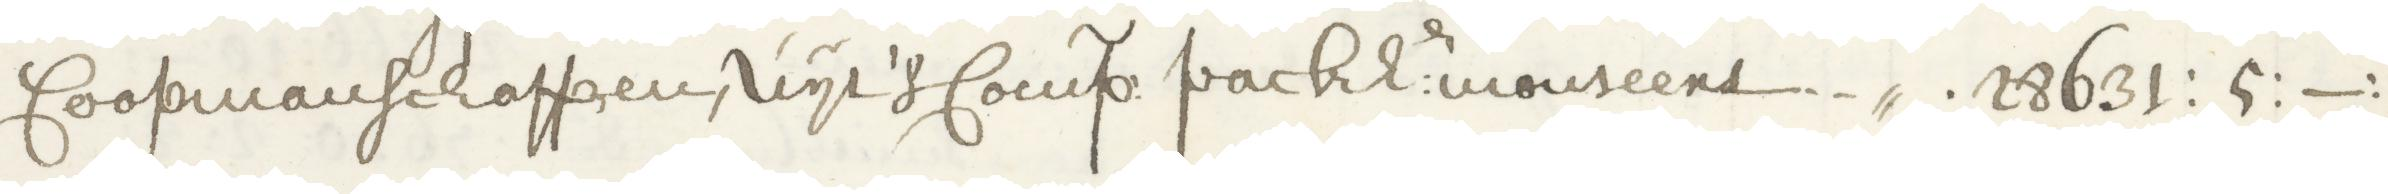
Coopmanschappen, uijt ’s Comp: packh:en monteert.- „. 28631: 5: —:
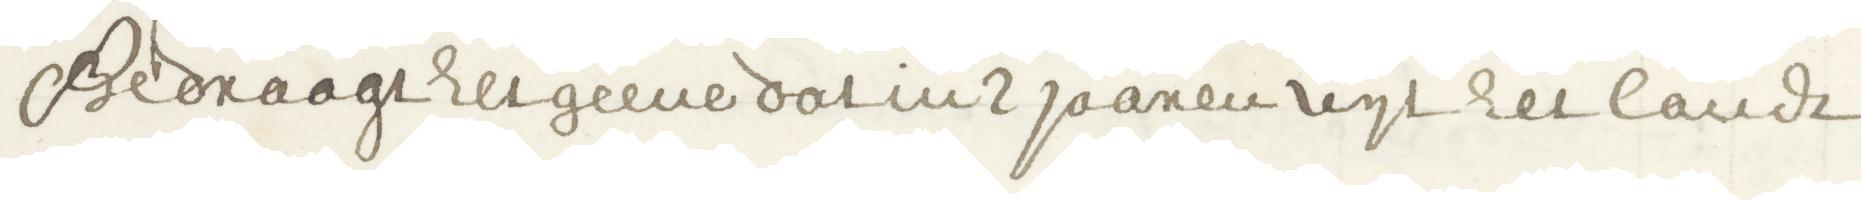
Bedraagt het geene dat in 2 Jaaren uijt het landt
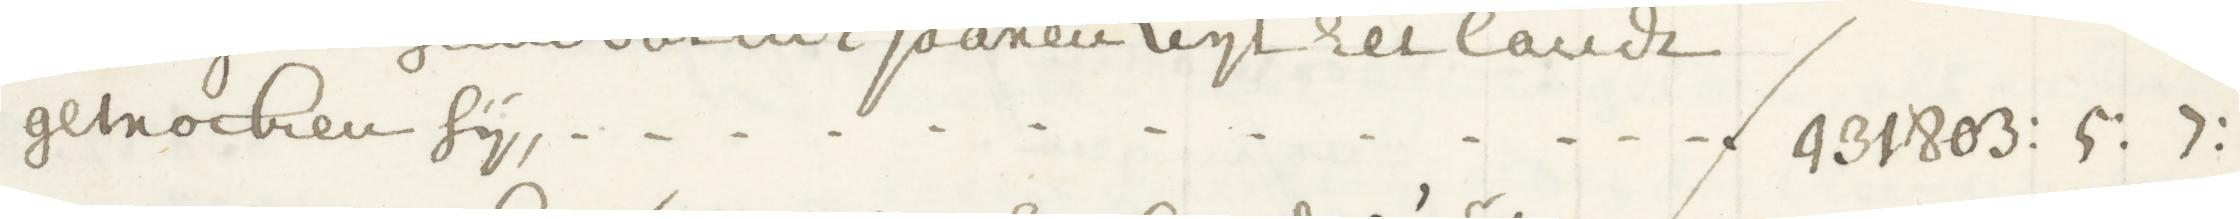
getrocken sij, - - - - - - - - - - - - - - ƒ 431803: 5: 7:
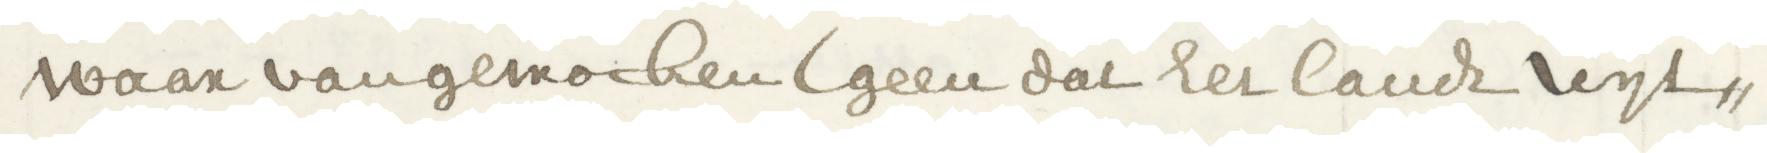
waar van getrocken t geen dat het landt uijt„
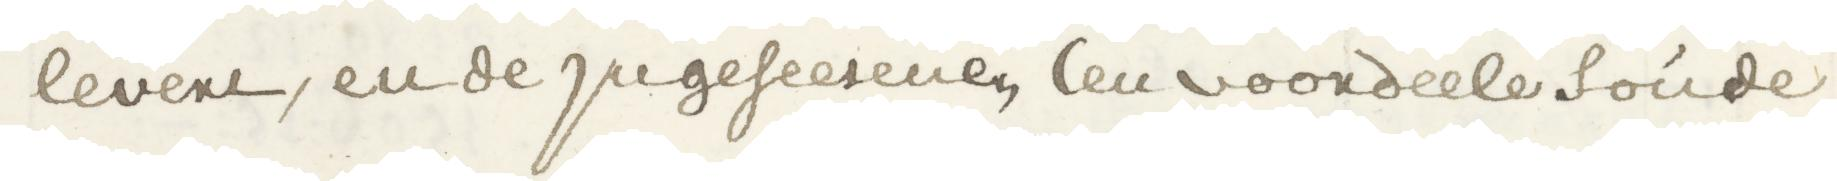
levert, en de Jngeseetenen ten voordeele Soude
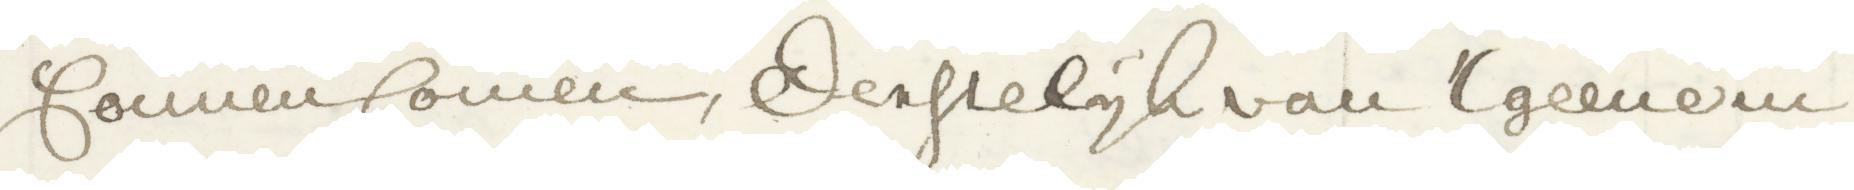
Connen Comen, Eerstelijk van 't geene in
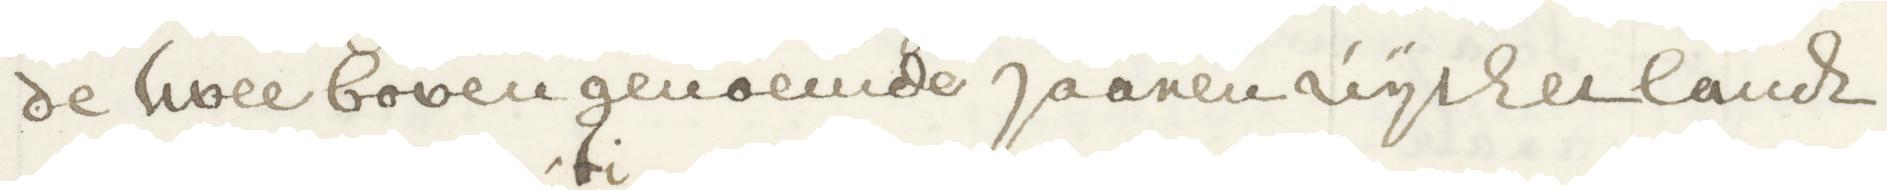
de twee boven genoemde Jaaren uijt het landt
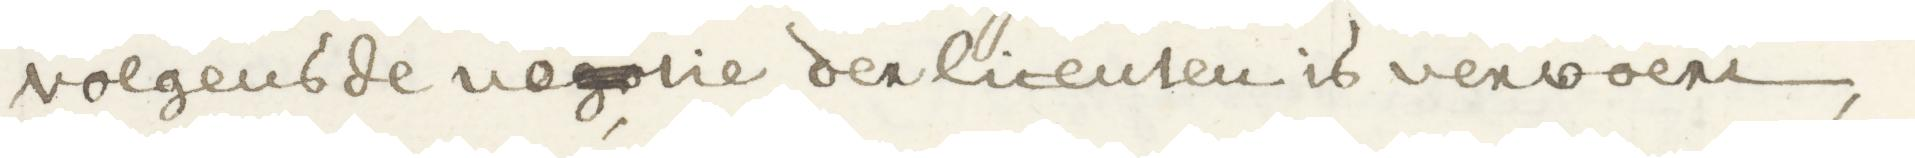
volgens de no,goti,tie der licenten is vervoert,
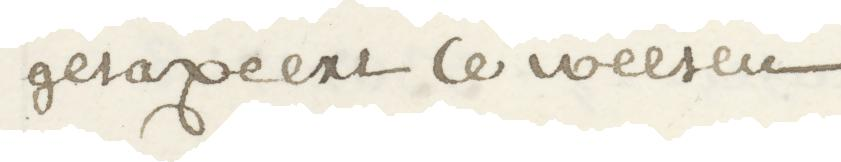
getaxeert te weesen
